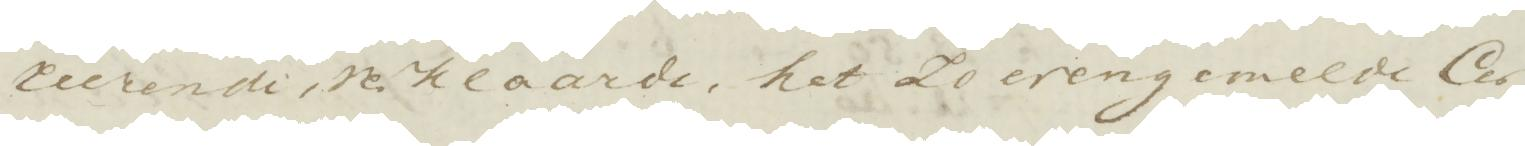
reerende, verklaarde, het zo evengemelde Cer
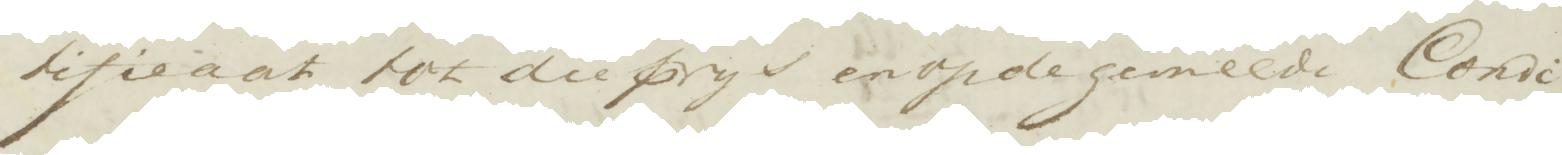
tificaat tot die prys en op de gemelde Condi
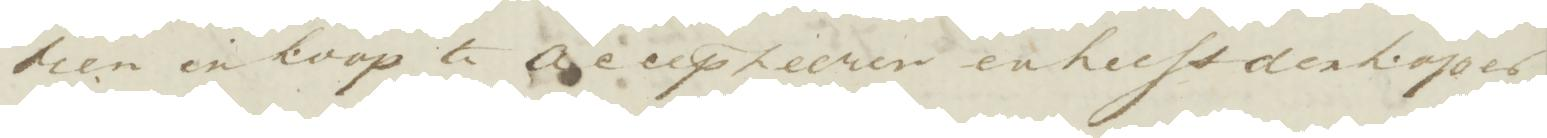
tien en koop te accepteeren en heeft der koper
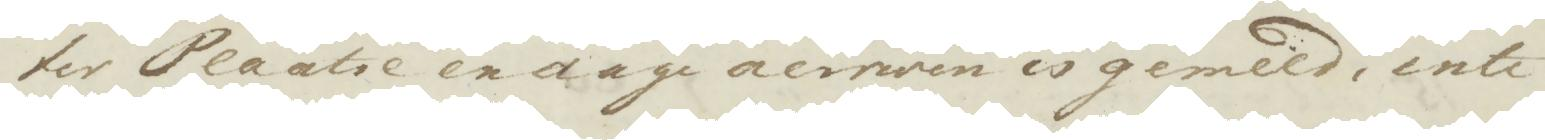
ter Plaatse en dage als voren is gemeld, in te
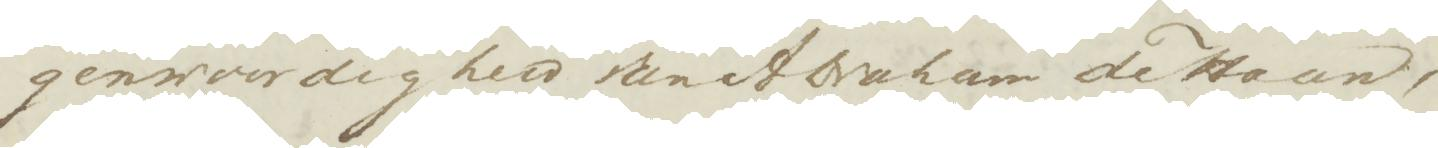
genwoordigheid van Abraham de Haan,
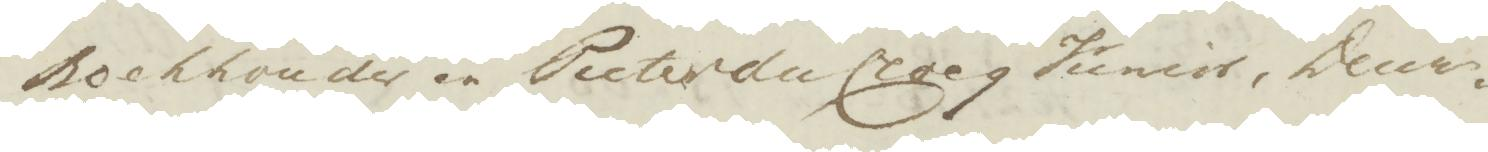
Boekhouder en Pieter du Crocq Junior Deur„
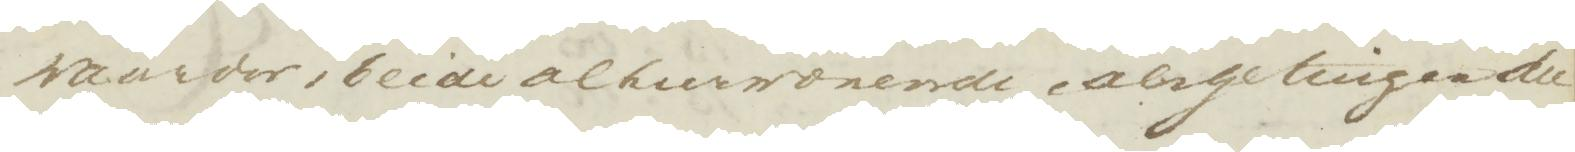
waarder, beide alhierwonende, als getuigen die
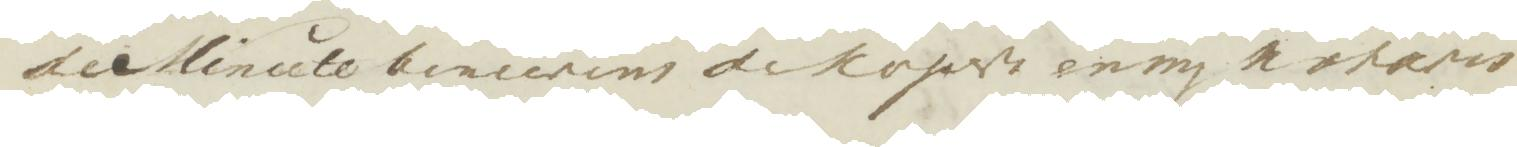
de Minute beneevens de koper en my notaris
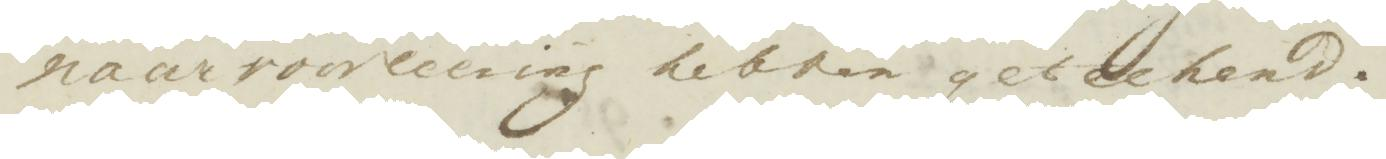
naar voorleesing hebben geteekend.
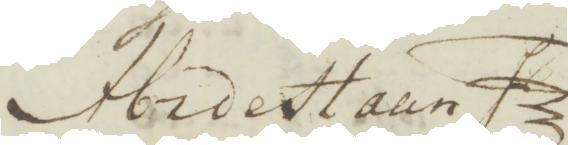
Abr de Haan Jr
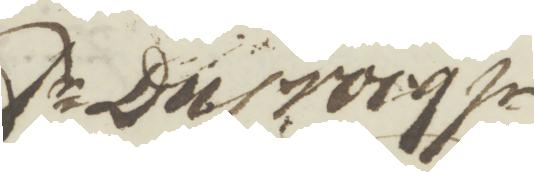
P=r Du Crocq jr
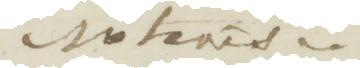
Notaris-
